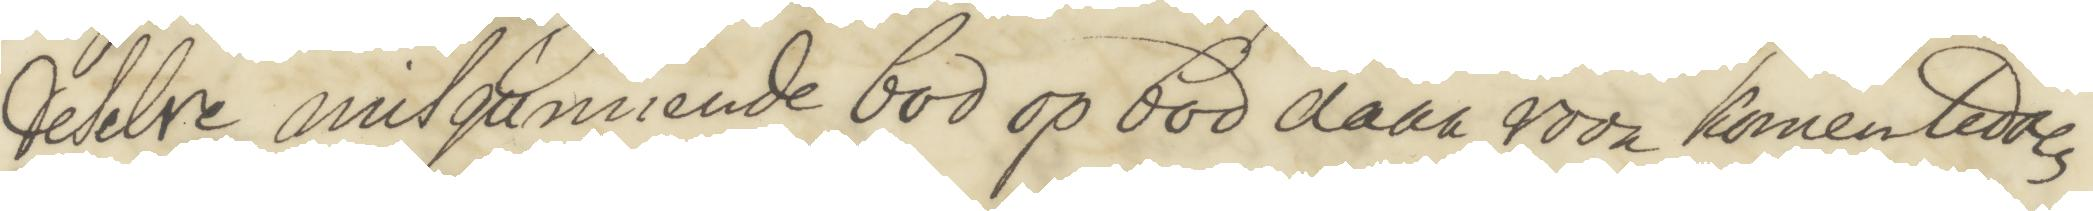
deselve misgunnende bod op bod daar voor komen tedoen
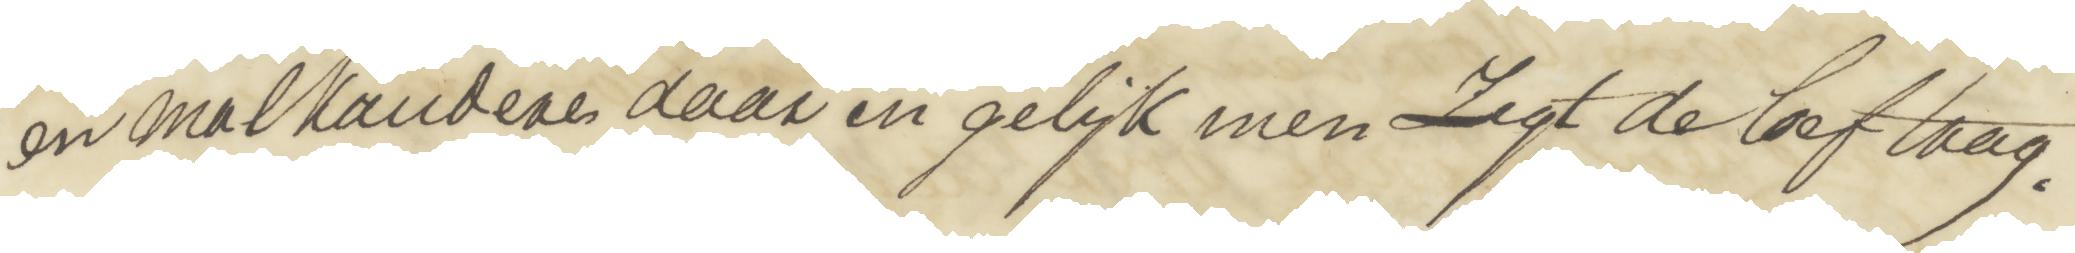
en malkandere daar in gelijk men zigt de loef trag„
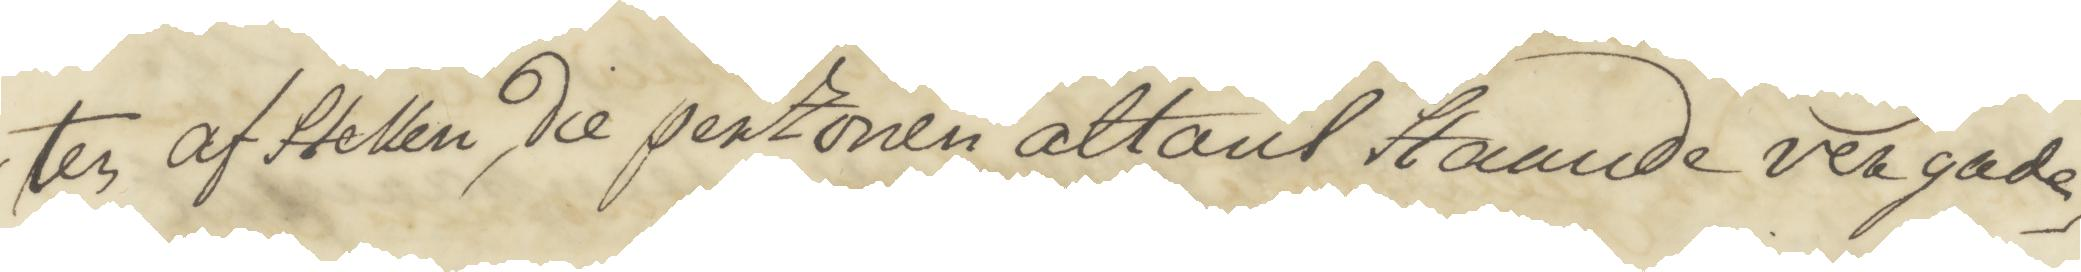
ten af stellen, die perzonen altans staande ver gade„
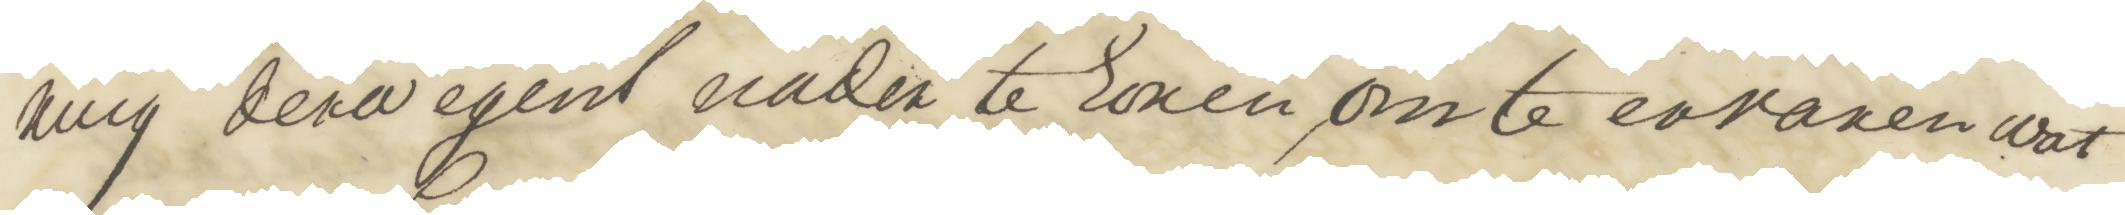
ring derwegens nader te horen om te ervaren wat
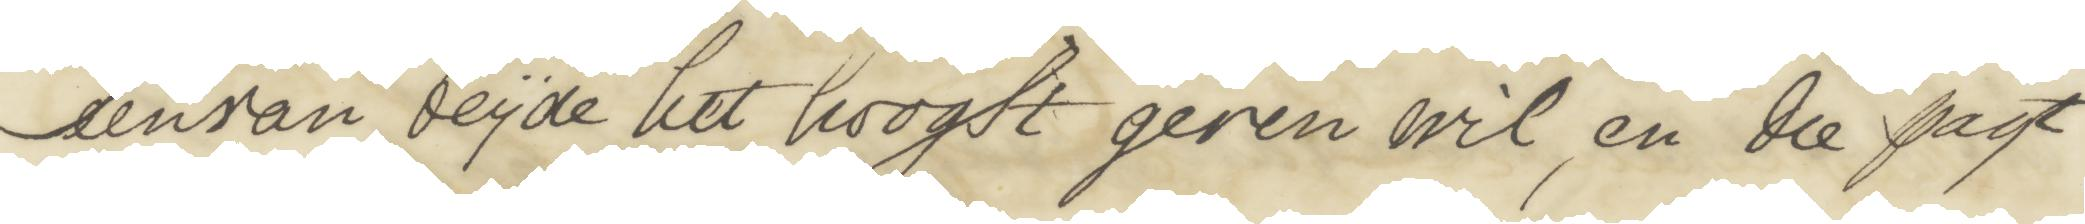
een van beijde het hoogst geven wil, en die pagt
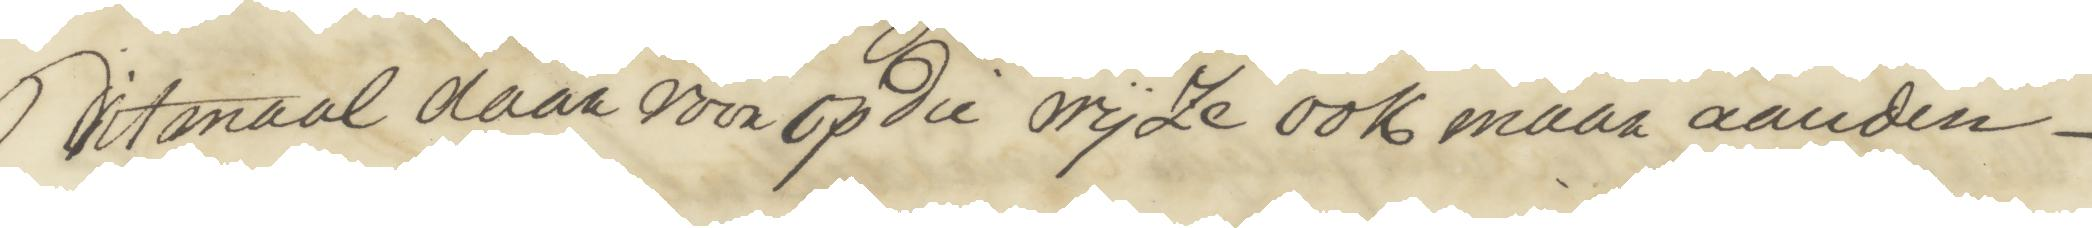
ditmaal daar voor op die wijze ook maar aanden
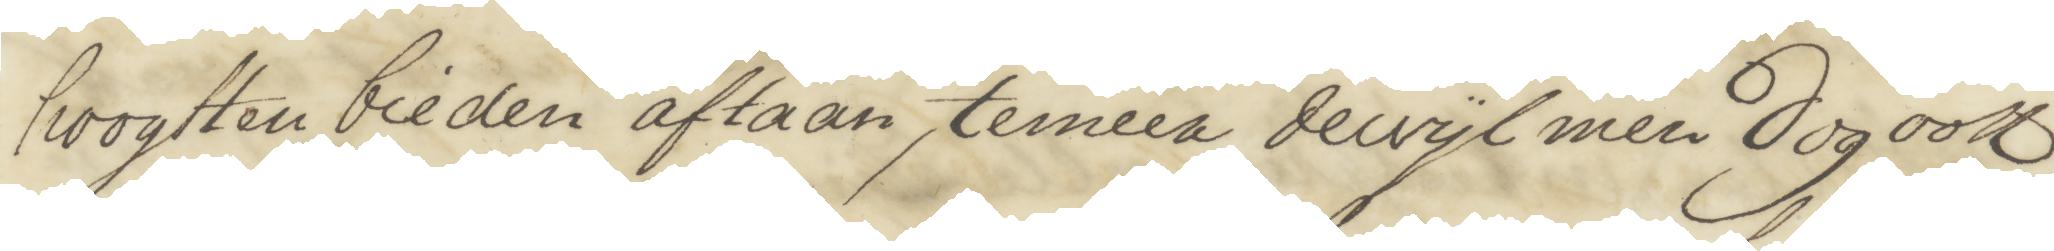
hoogsten bieden aftaan, temeer dewijl men dog ook
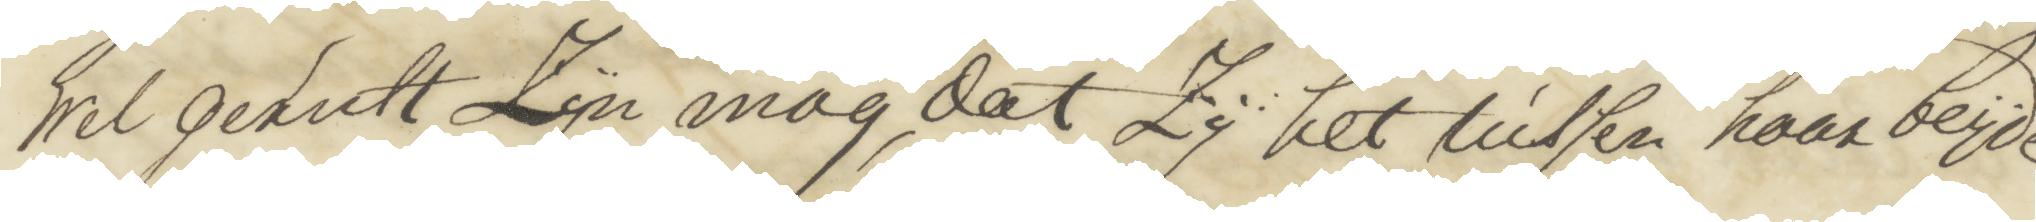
wel gerust zijn mag, dat zij het tussen haar beijde
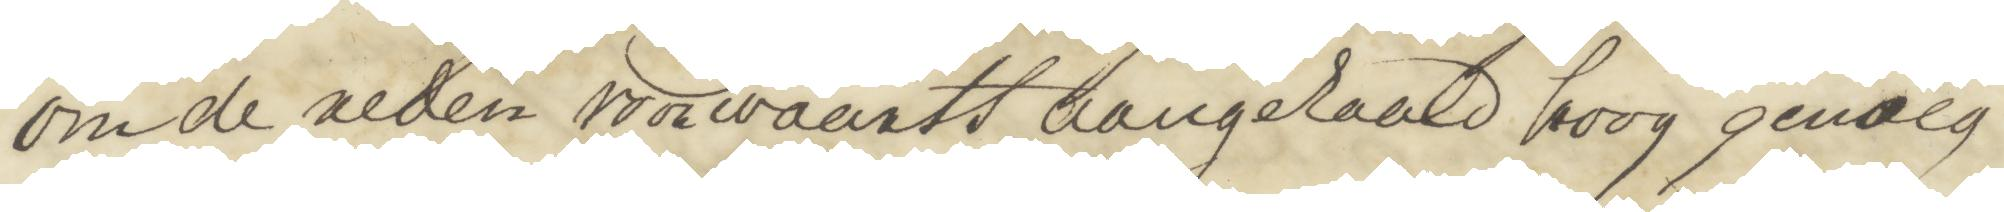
om de reden voorwaarts aangehaald hoog genoeg
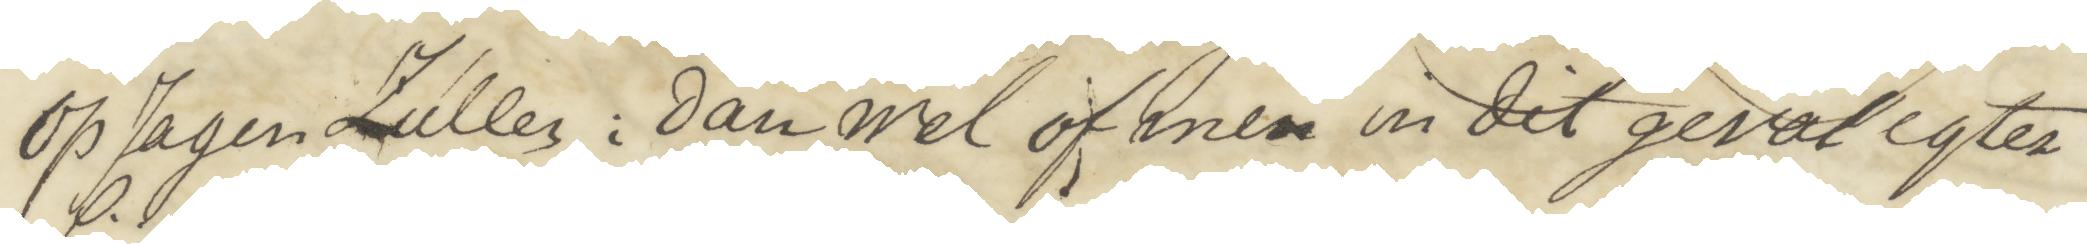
op Jagen zullen: dan wel of men in dit geval egter
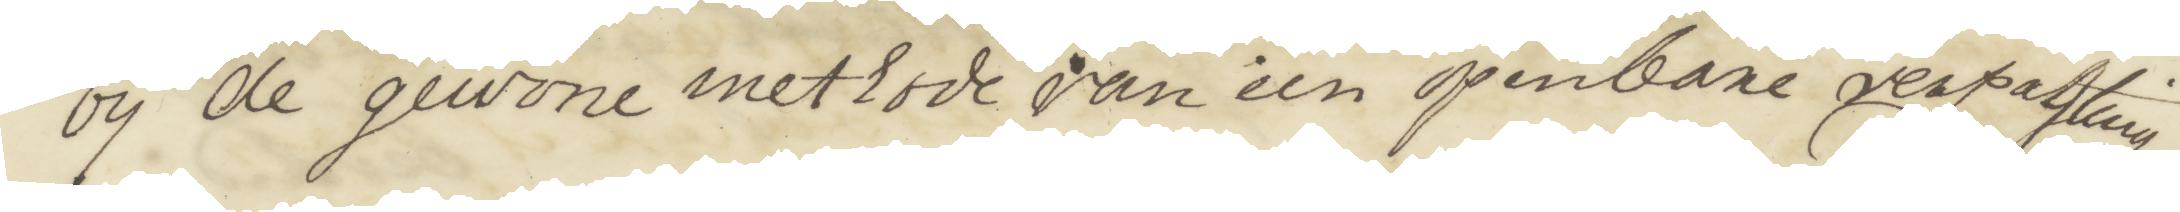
bij de gewone methode van een openbare verpagting
